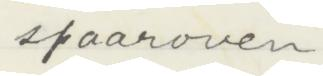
spaaroven
